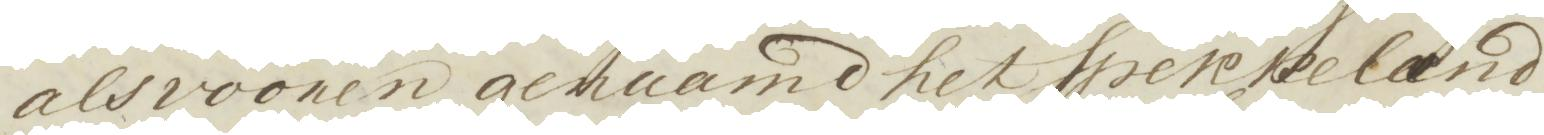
als vooren genaamd het Spekkeland
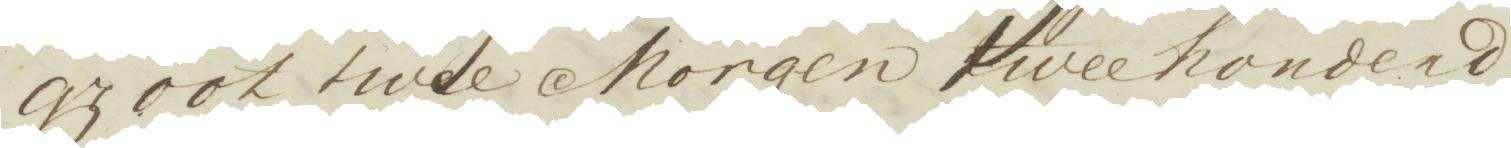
groot twee Morgen twee honderd
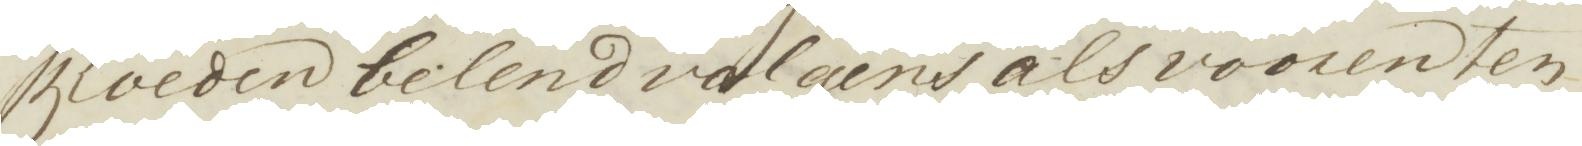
Roeden belend volgens als vooren ten
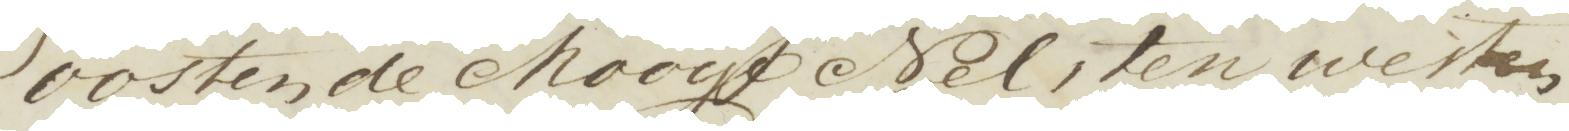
oosten de Mooye Nel, ten westen
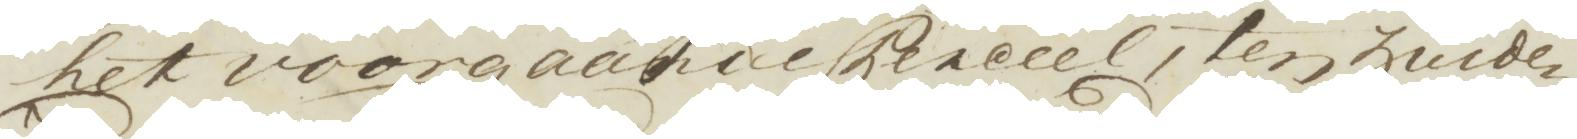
het voorgaande perceel, ten zuiden
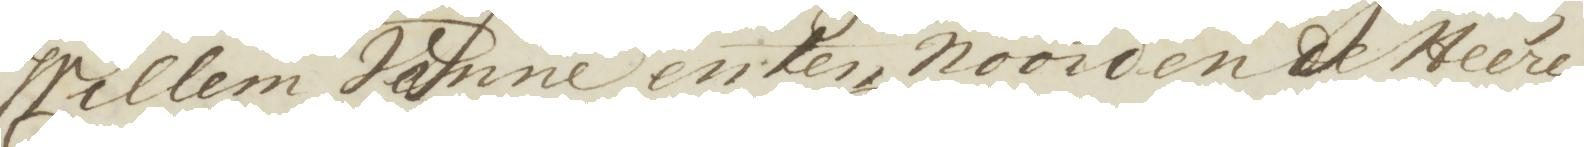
Willem Venne en ten noorden de Heeren
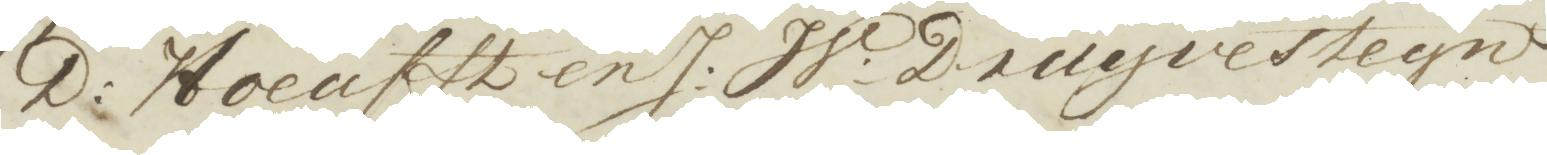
D: Hoeufft en J: W: Druyvesteyn
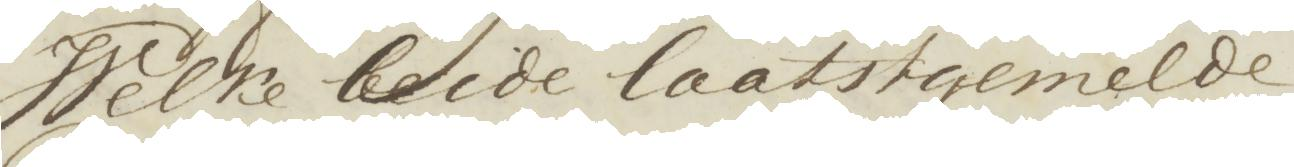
Welke beide laatstgemelde
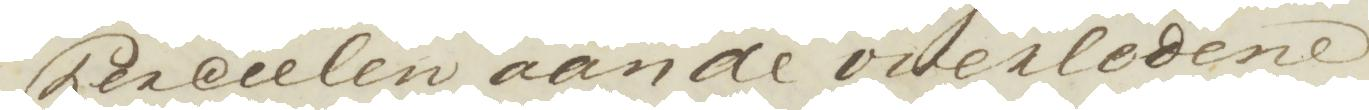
Perceelen aan de overledene
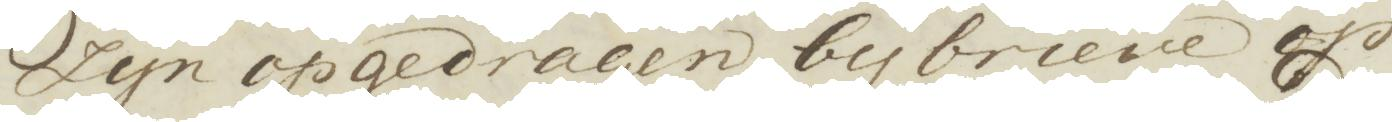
zyn opgedragen, by brieve op
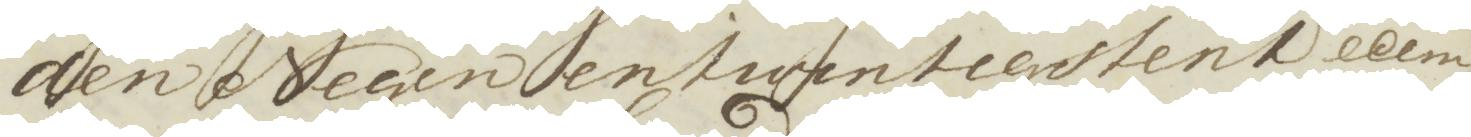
den Negen en twintigsten Decem
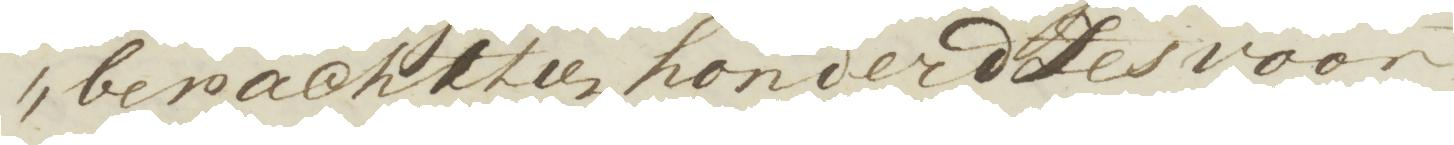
„ber achttien honderd Zes voor
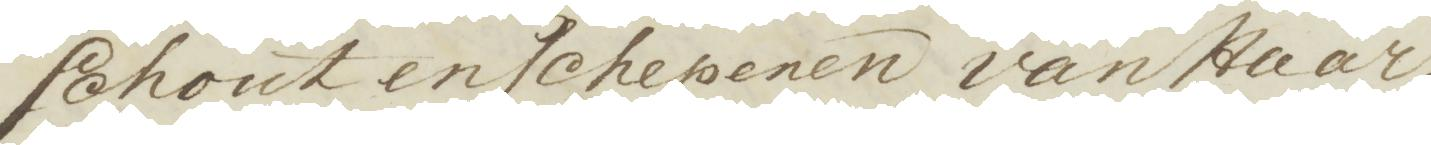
Schout en Schepenen van Haar
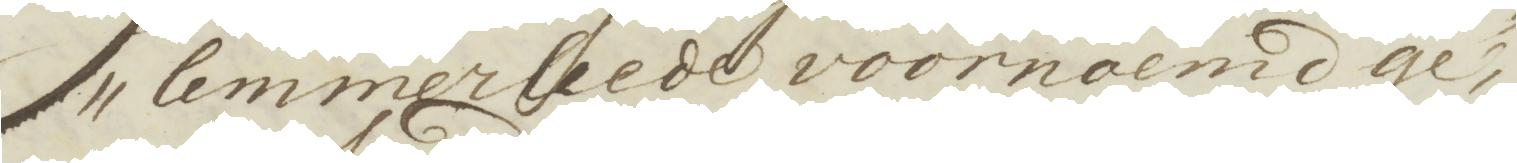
„lemmerliede voornoemd ge„
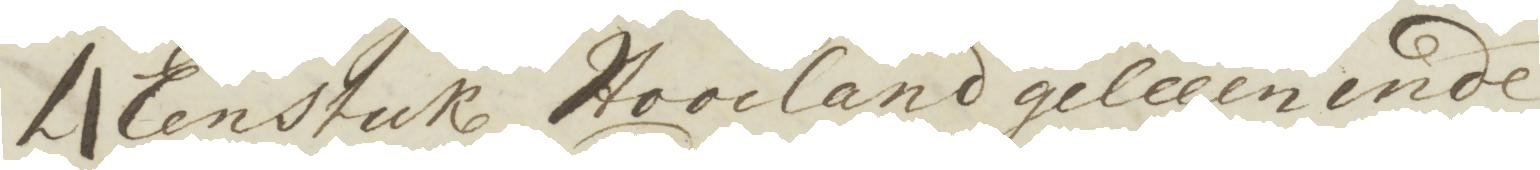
4 Een stuk Hooiland gelegen ende
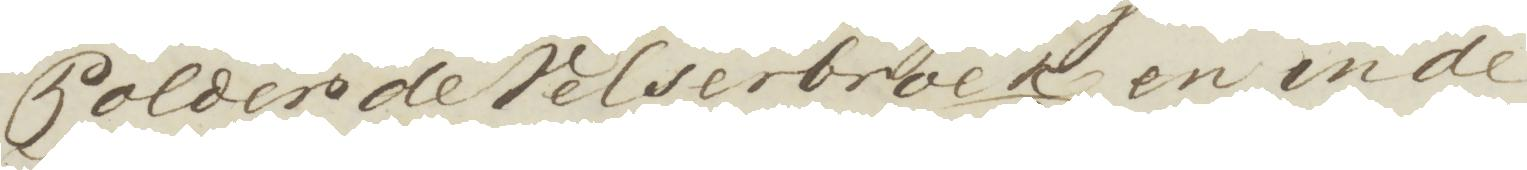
Polder de Velserbroek en in de
